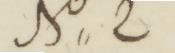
N„o 2
